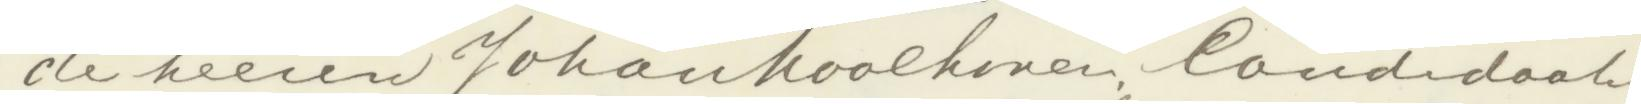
de heeren Johan Koolhoven, Candidaat
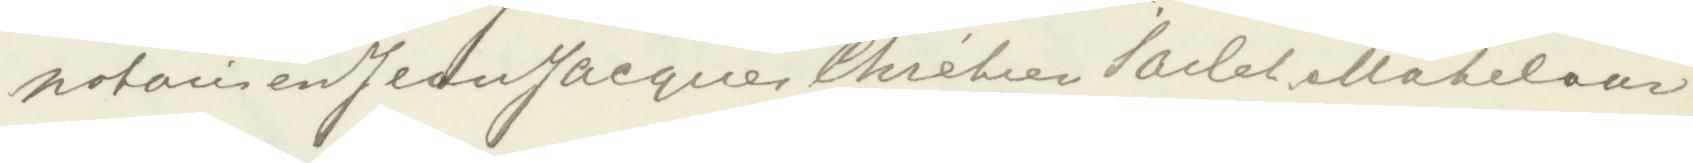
notaris en Jean Jeacques Chrétien Sarlet, Makelaar
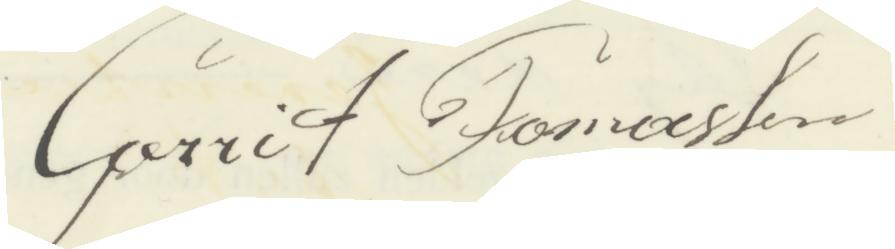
Gerrit Tomassen
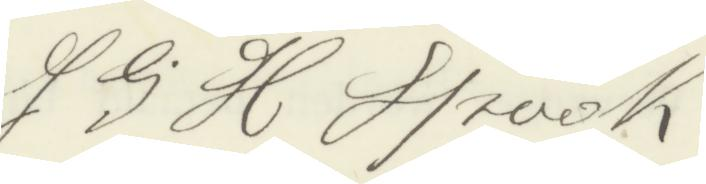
J.G.H. Strook
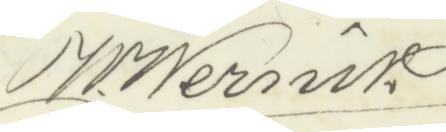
W Wernik.
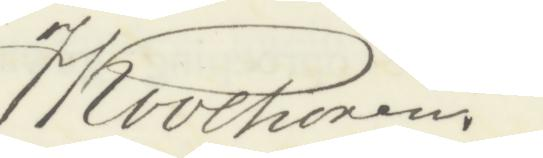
JKoolhoven
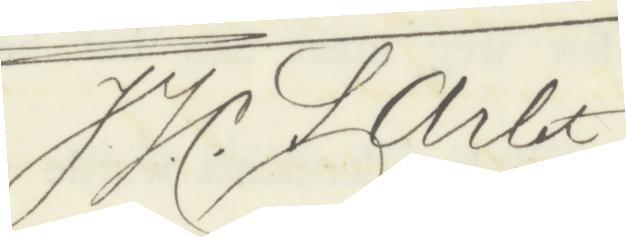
J.J.C.Sarlet
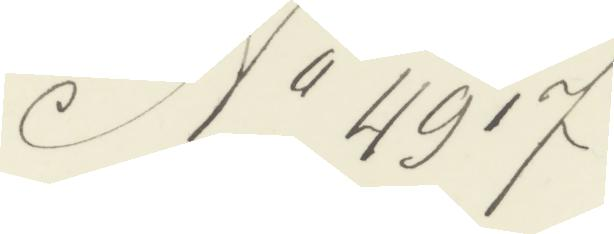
No 4917
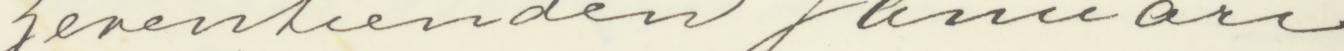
Zeventienden Januari
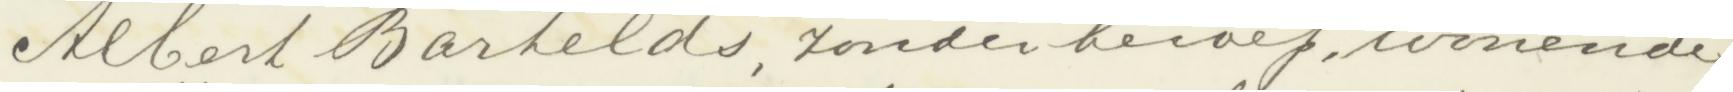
Albert Bartelds, zonder beroep, wonende
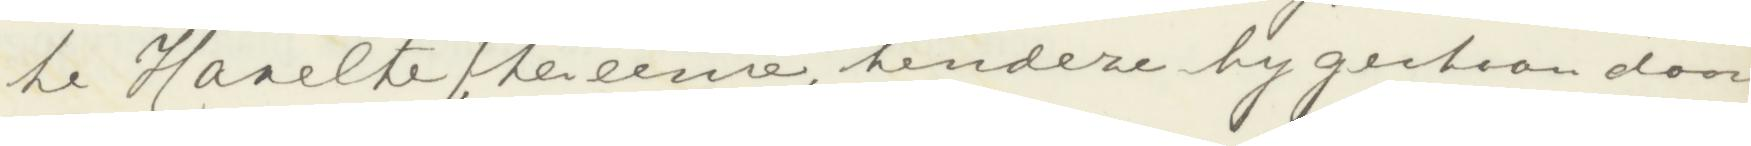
te Havelte ¶ ter eenre, tendeze bygestaan door
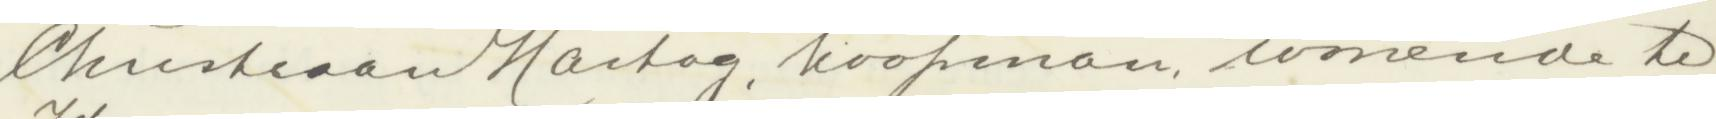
Christiaan Hartog koopman, wonende te
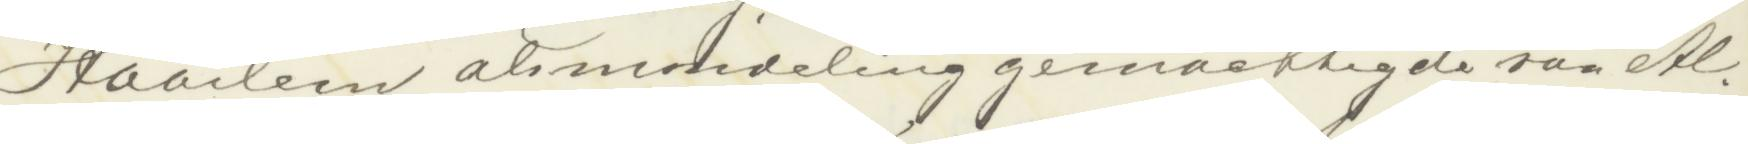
Haarlem, als mondeling gemachtigde van Al„
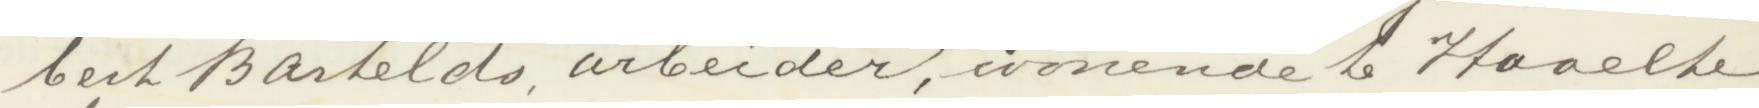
bert Bartelds, arbeider, wonende te Havelte
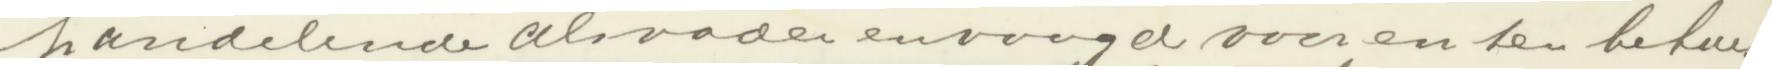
handelende als vader en voogd voor en ten behoe
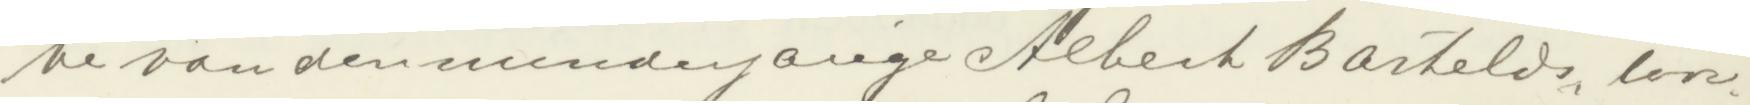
ve van den minderjarige Albert Bartelds, wor„
